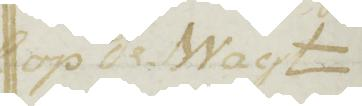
op de wagt
